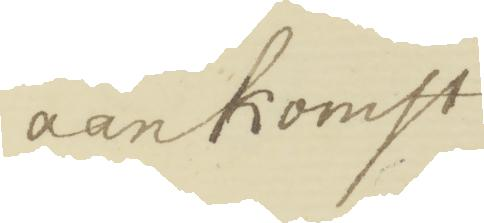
aankomst
